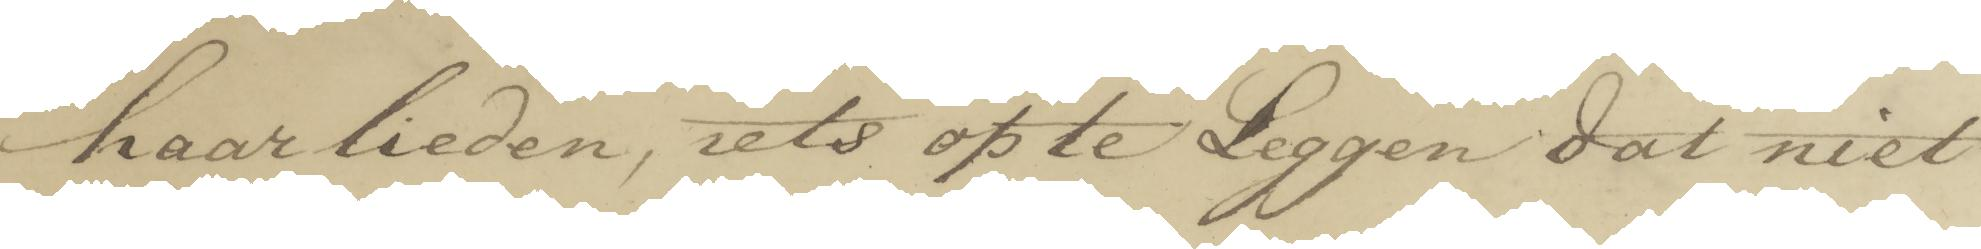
haar lieden, iets op te Leggen dat niet
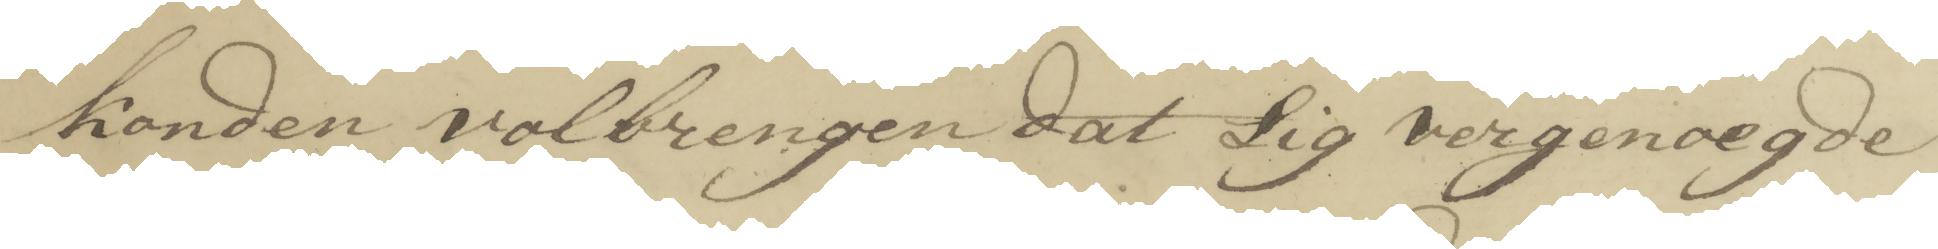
konden volbrengen dat sig vergenoegde
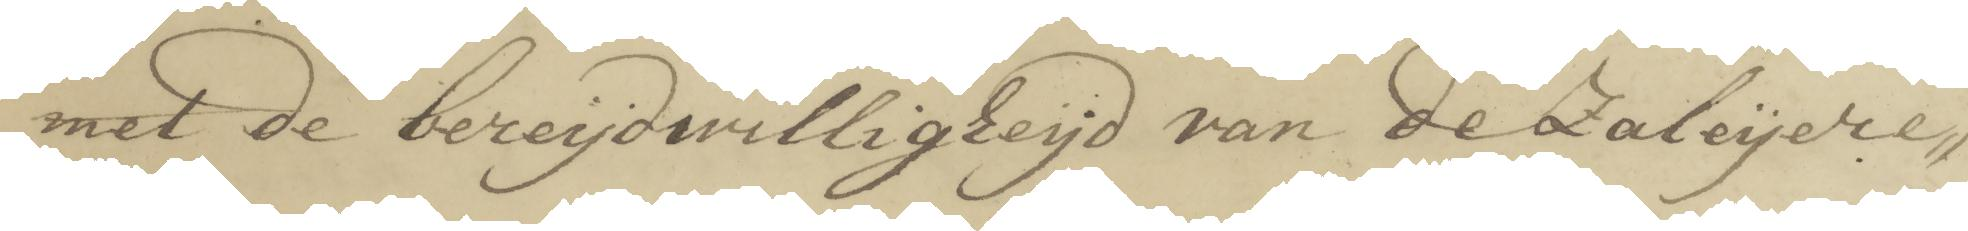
met de bereijdwilligheijd van de zaleijere„
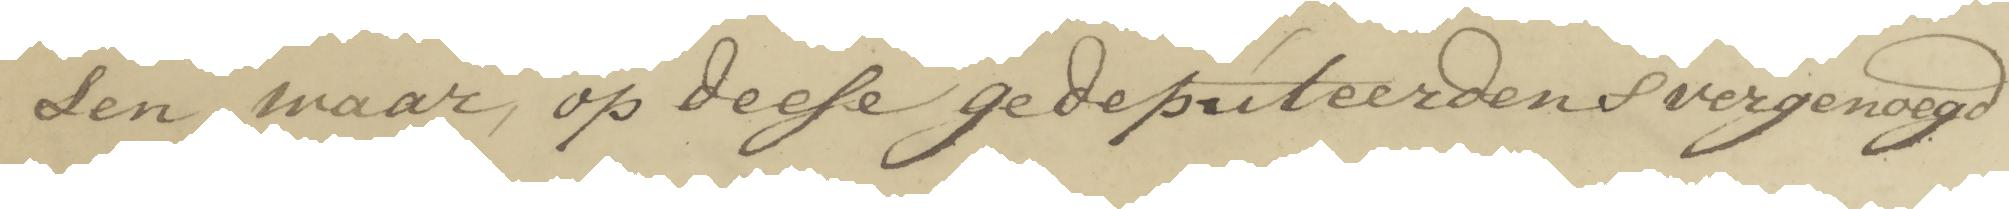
sen waar, op deese gedeputeerdens vergenoegd
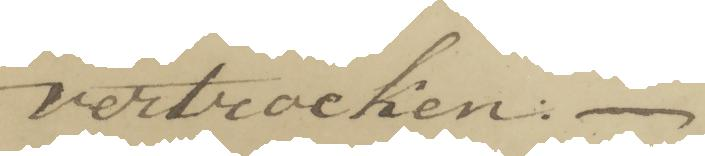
vertrocken: —
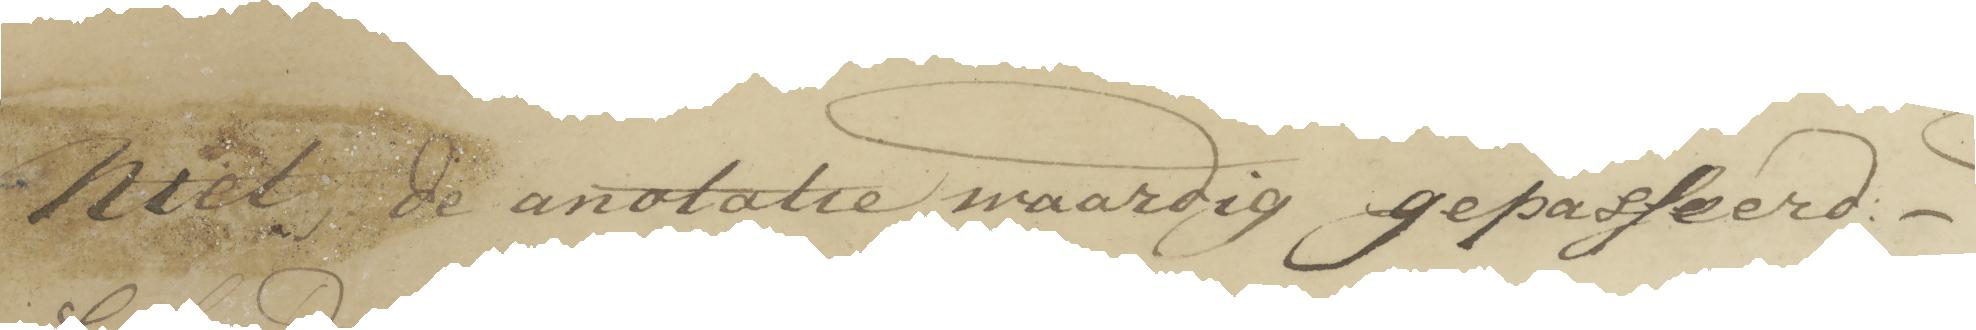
Niet, de anotatie waardig gepasseerd: —
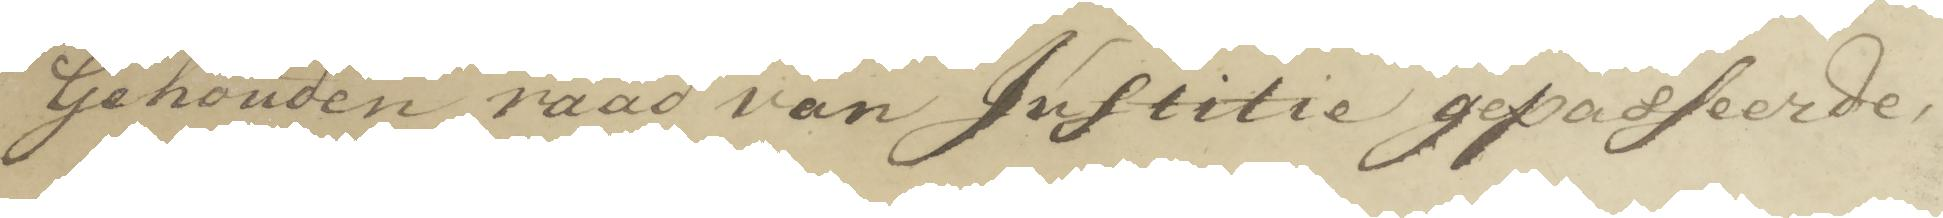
Gehouden raad van Justitie gepasseerde,
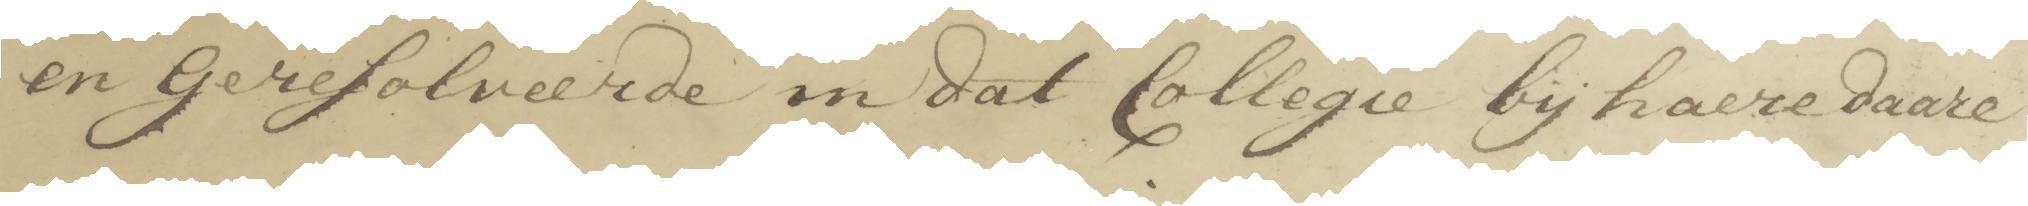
en Geresolveerde in dat Collegie bij haere daare
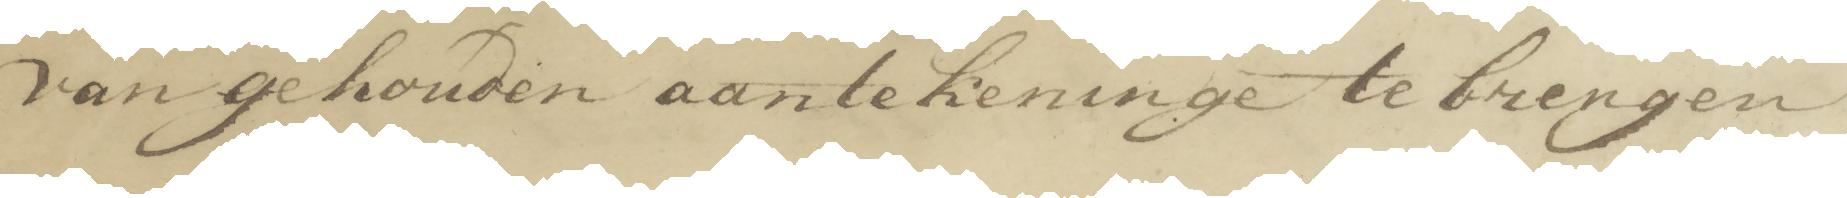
van gehouden aantekeninge te brengen
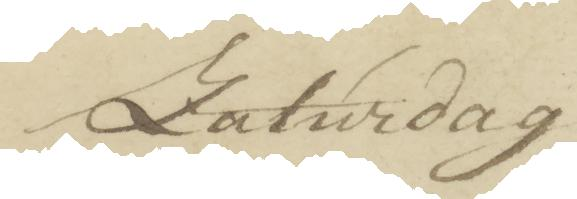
Zaturdag
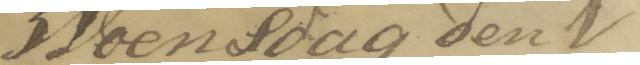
Woensdag den 1
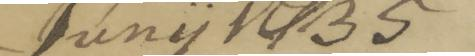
Junij 1735
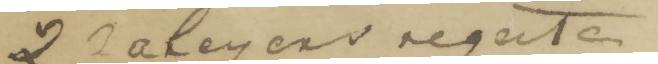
2 zaleyers regeste
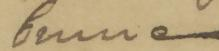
binne
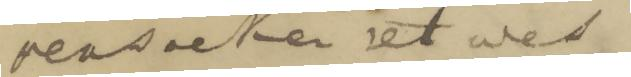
versoeken iet wes
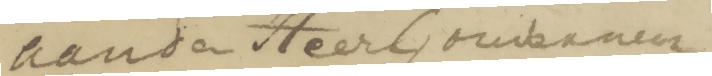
aanden Heer Gouverneur
